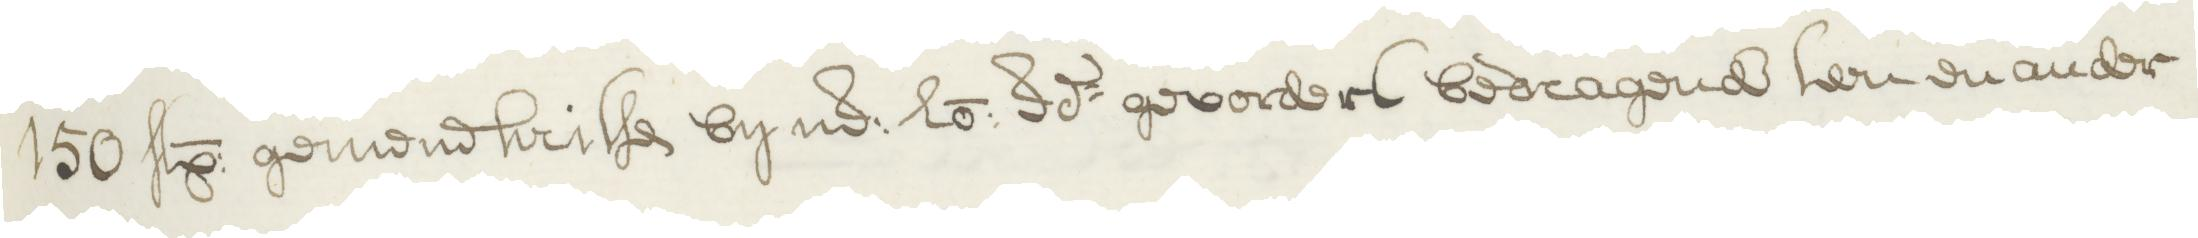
150 stx: gemene kritsen by uE: ho: Ed=e gevordert bedragende teen en ander
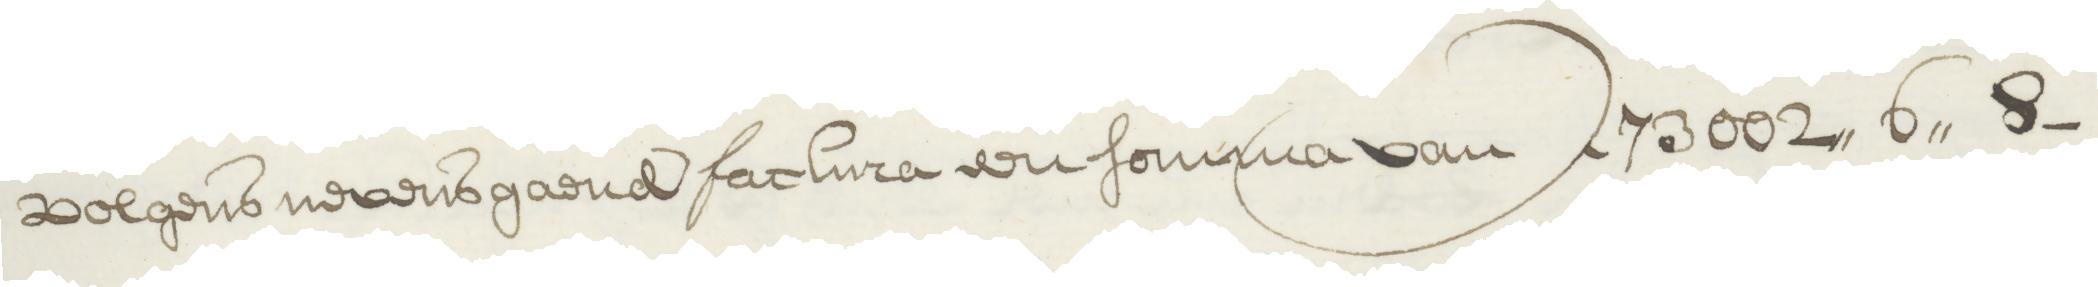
volgens nevens gaende factura een somma van ƒ73002„ 6„ 8–
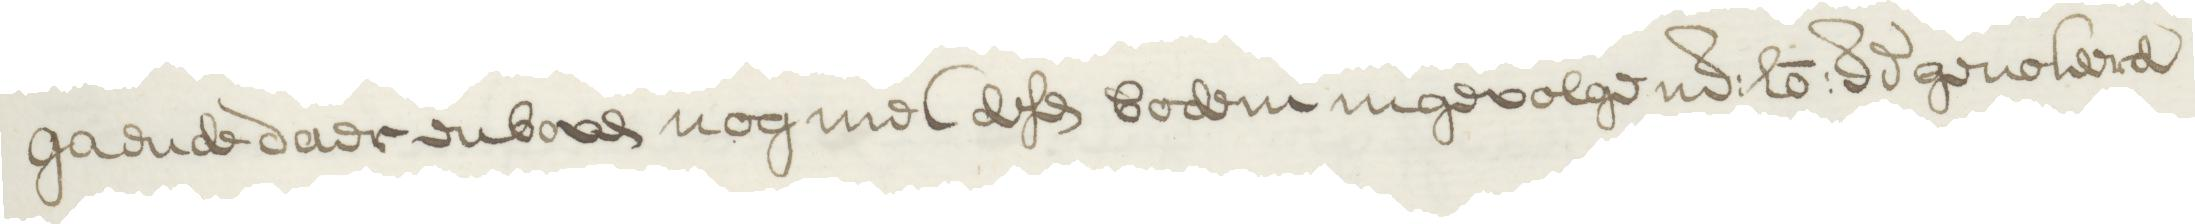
gaende daer en boven nog met desen bodem ingevolge uE: ho: Ede genoteerde
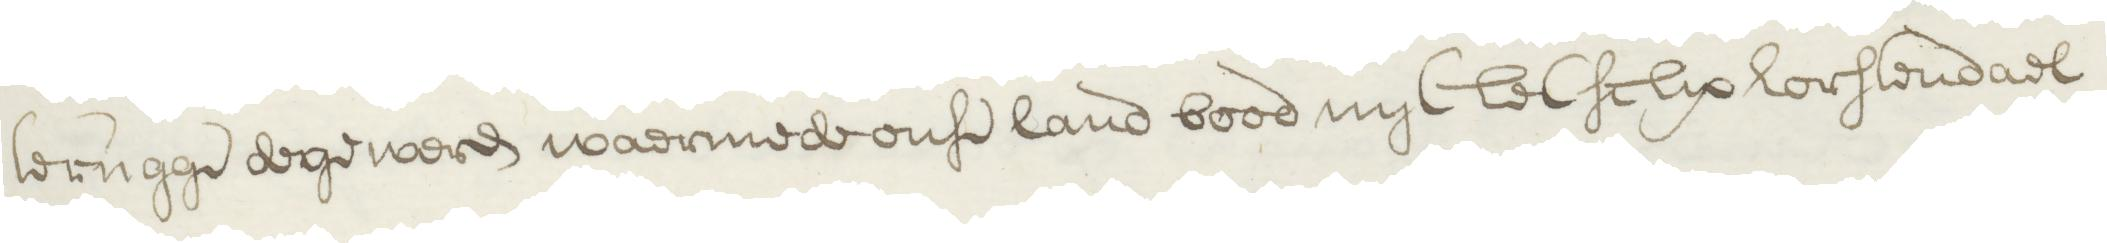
terugge degeweren waermede onse land bood uyt het schip horstendael
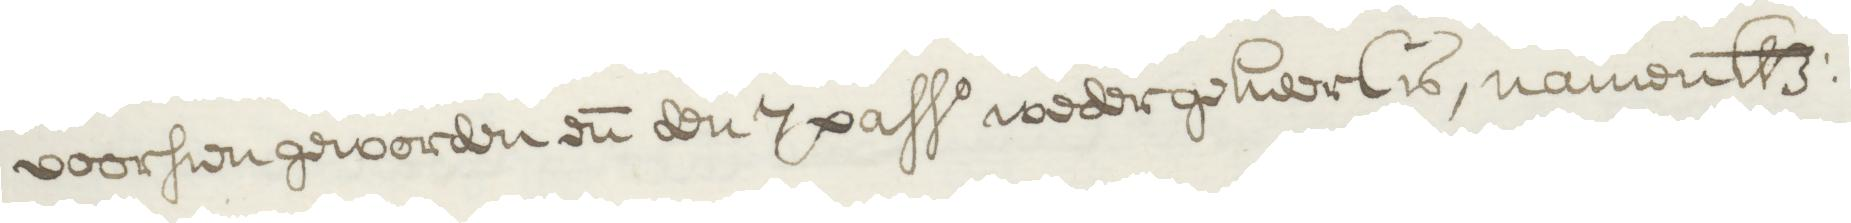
voorsien geworden en den 7 passo wedergekeert is, namentlijk
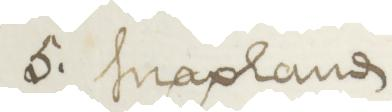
5. snaphanen
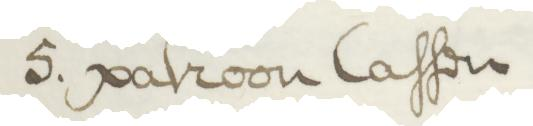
3. patroon tassen
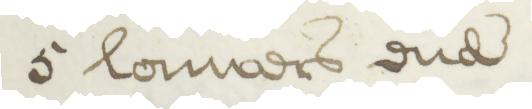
5 houwers ende
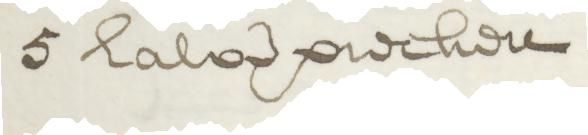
5 halve piecken
